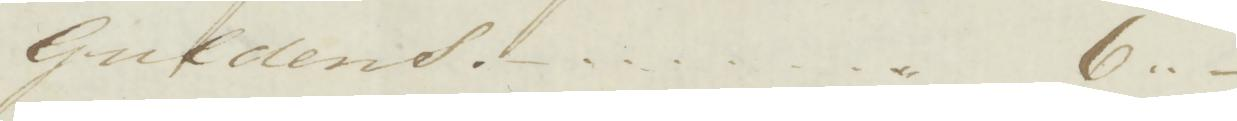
Guldens. 6 „-
